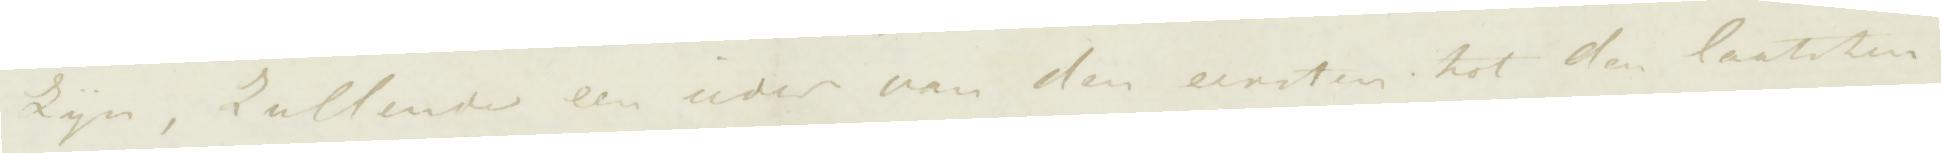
Zijn, Zullende een ieder van den eersten tot den laatsten
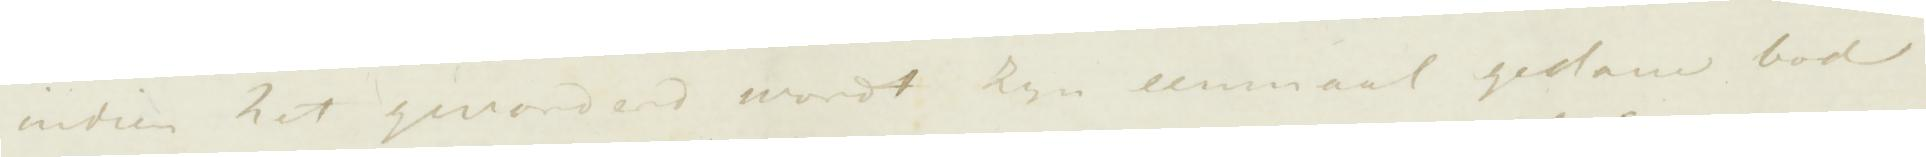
indien het gevorderd wordt Zyn eenmaal gedane bod
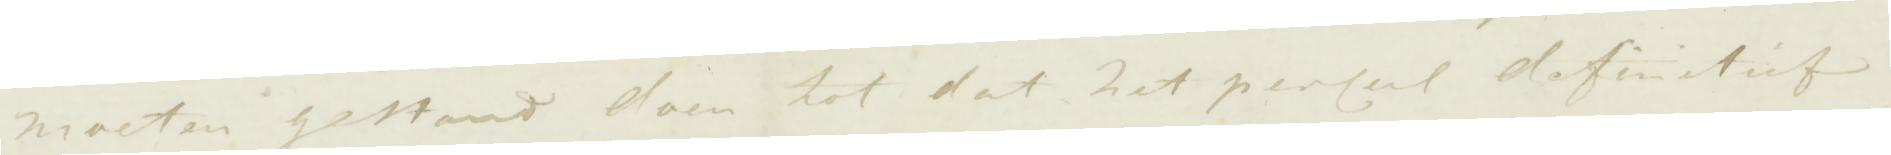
moeten gestand doen tot dat het perceel definitief
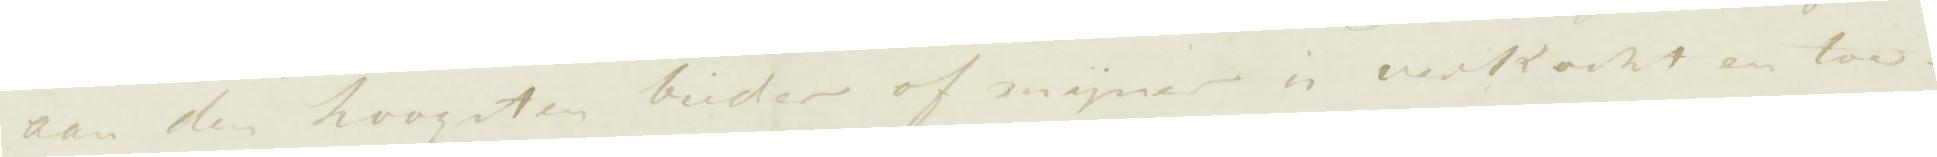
aan den hoogsten bieder of mijner is verkocht en toe
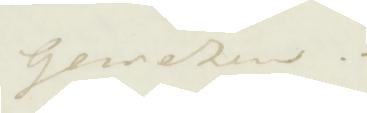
gewezen
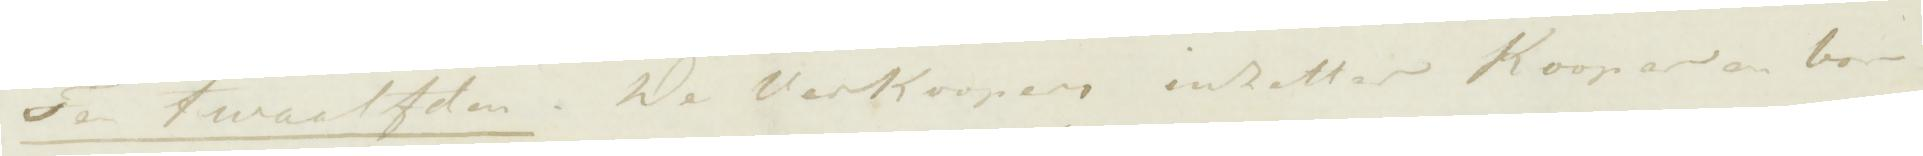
Ten twaalfden. De verkoopers inzetter Kooper en bor
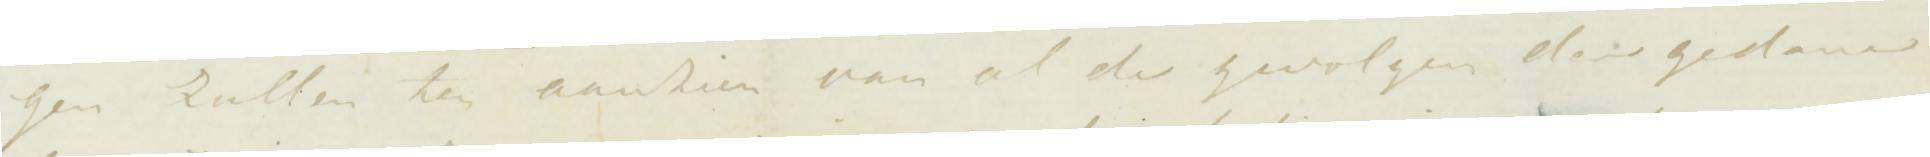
gen Zullen ten aanzien van al die gevolgen der gedane
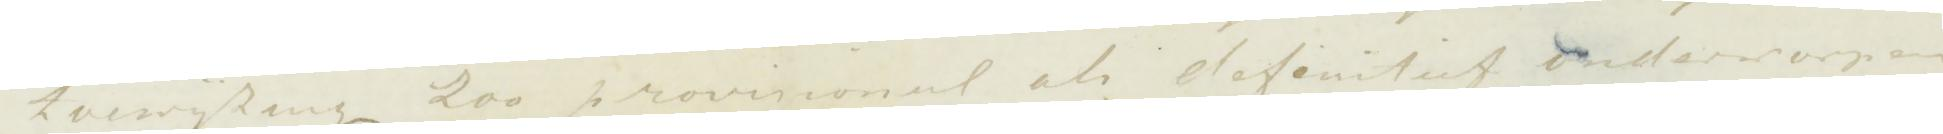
toewijzing Zoo provisioneel als definitief onderworpen
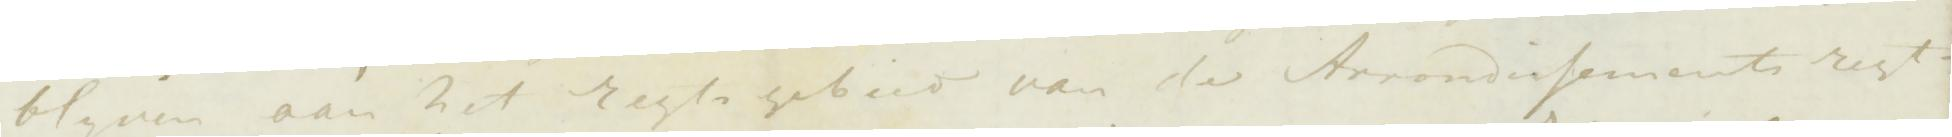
blyven aan het regtsgebied van de Arrondissements regt
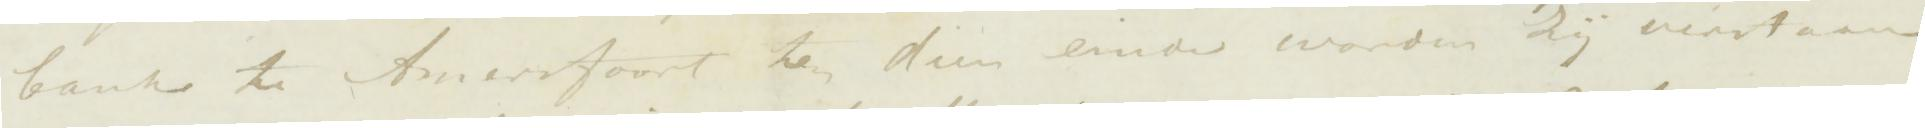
bank te Amersfoort ten dien einde worden Zij verstaan
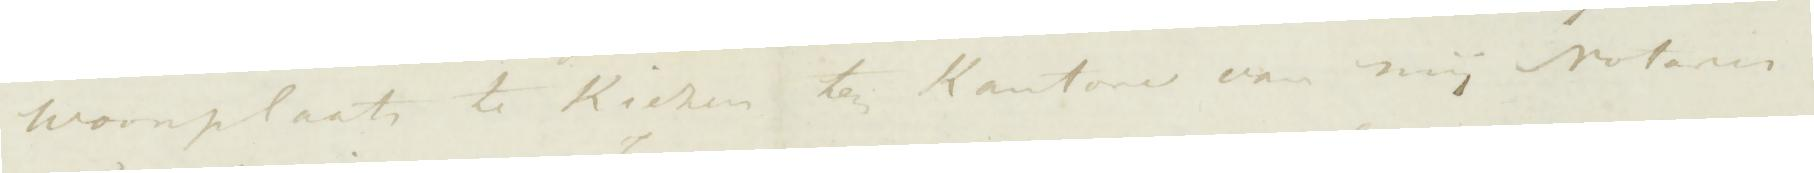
woonplaats te Kiezen ten kantore van mij Notaris
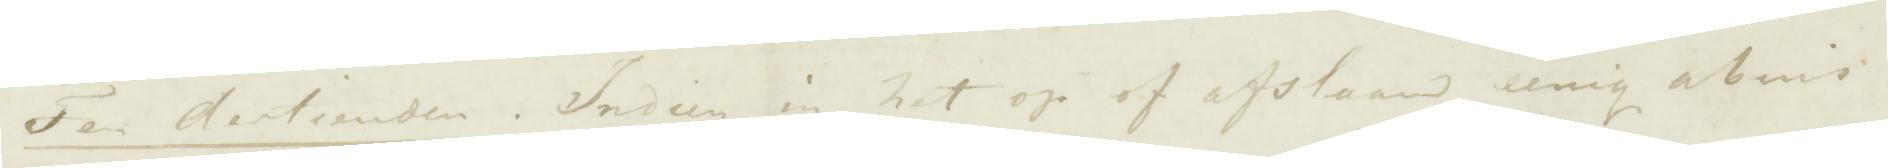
Ten dertienden. Indien in het op of afstaan eenig abuis
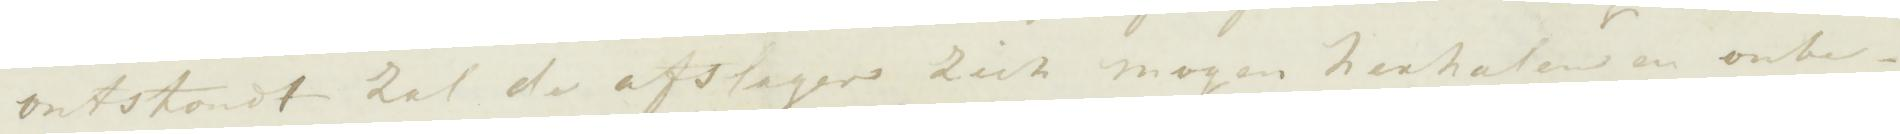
ontstondt Zal de afslager zich mogen herhalen en onbe-
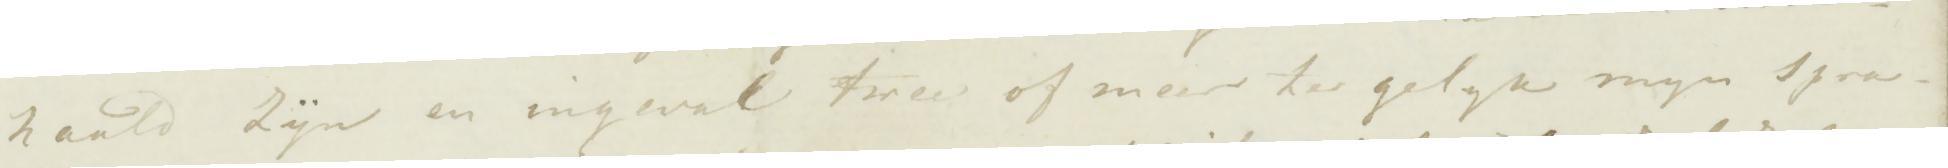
haald Zijn en ingeval twee of meer te gelyk myn spra
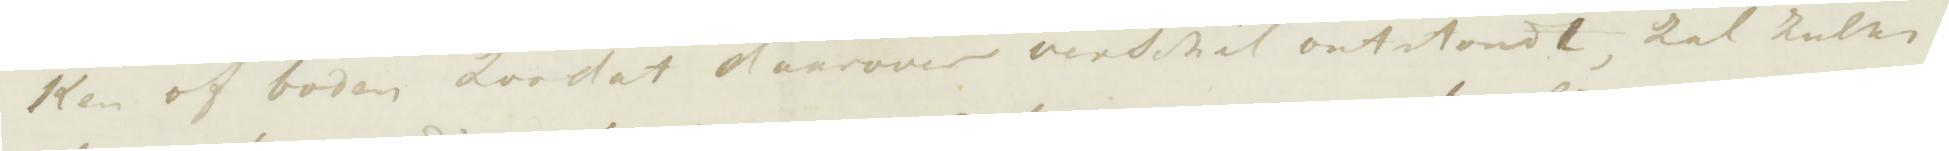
ken of boden Zoo dat daarover verschil ontstondt, Zal Zulks
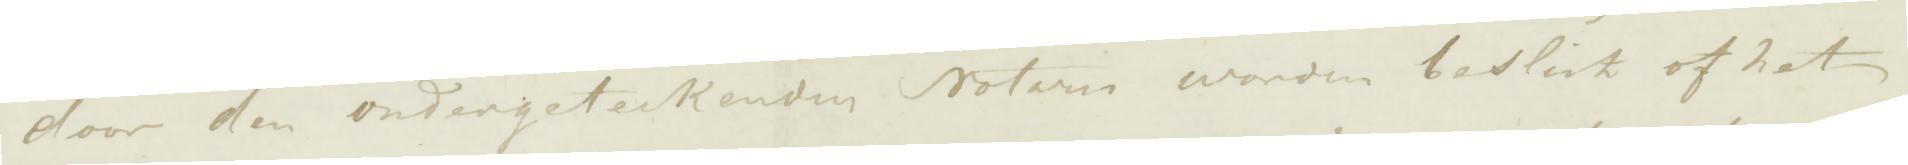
door den ondergeteekenden Notaris worden beslist of het
